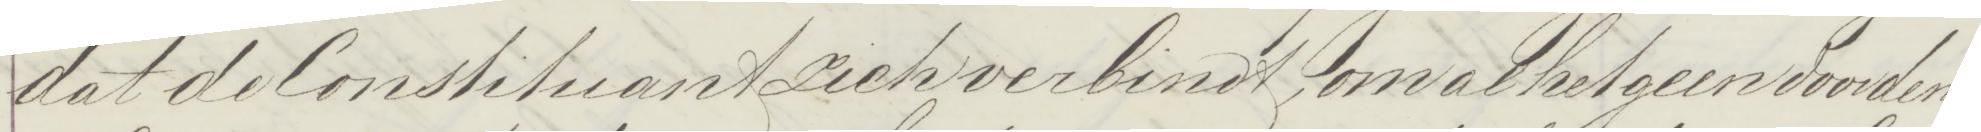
dat de Constituant zich verbindt, om al het geen door den
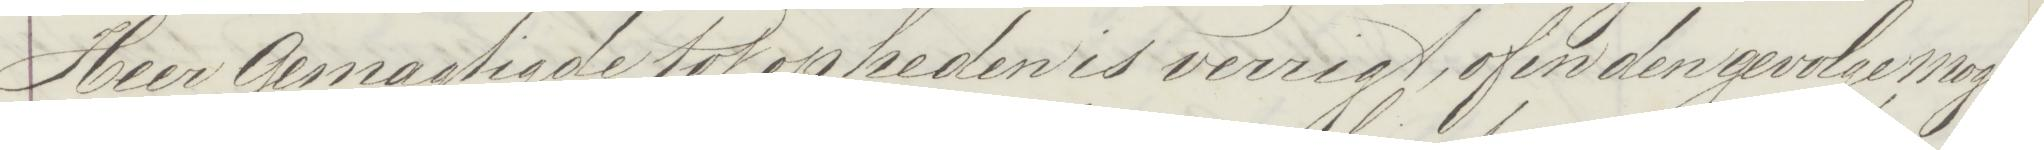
Heer Gemagtigde tot op heden is verrigt, of in den gevolge mogt
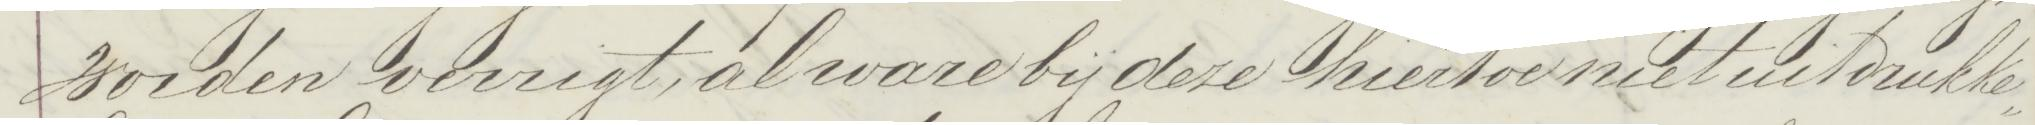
worden verrigt, al ware bij deze hiertoe niet uitdrukke„
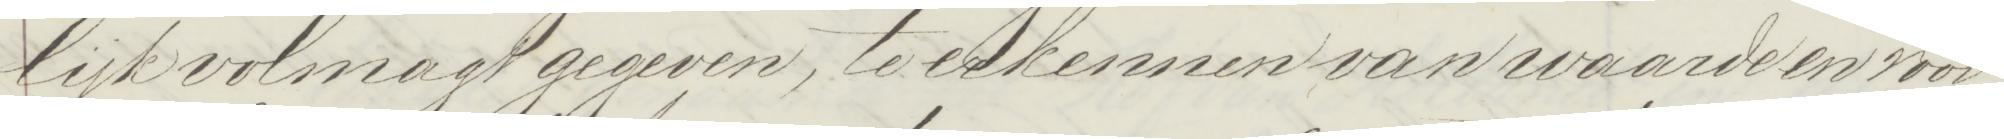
lijk volmagt gegeven, te erkennen van waarde en voor
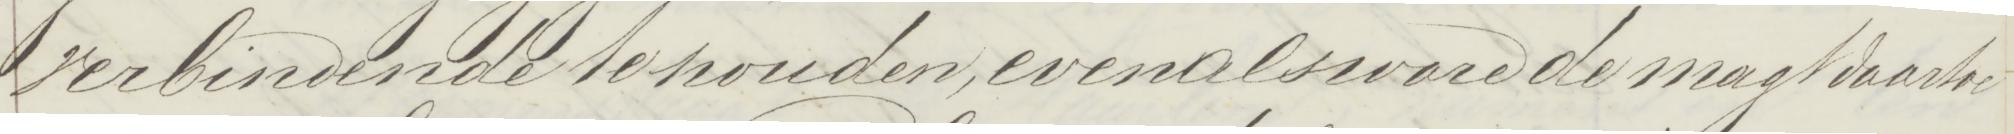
Verbindende te houden, even als ware de magt daartoe
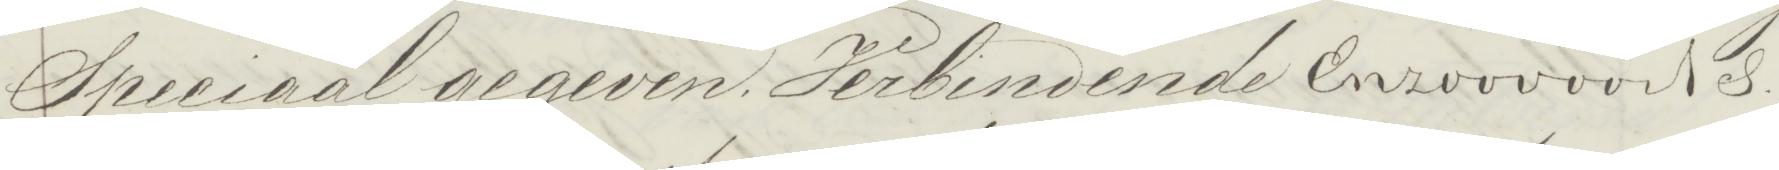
Speciaal gegeven. Verbindende Enzoovoors &.
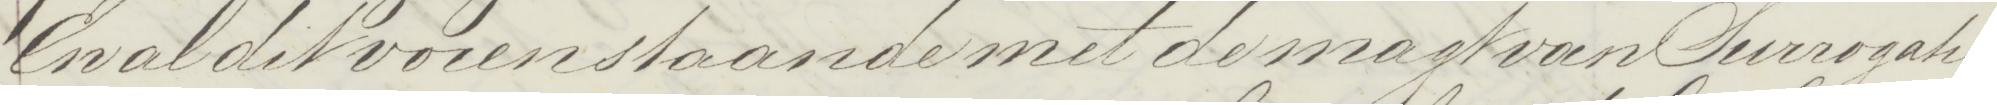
En al dit vorenstaande met de magt van Surrogatie
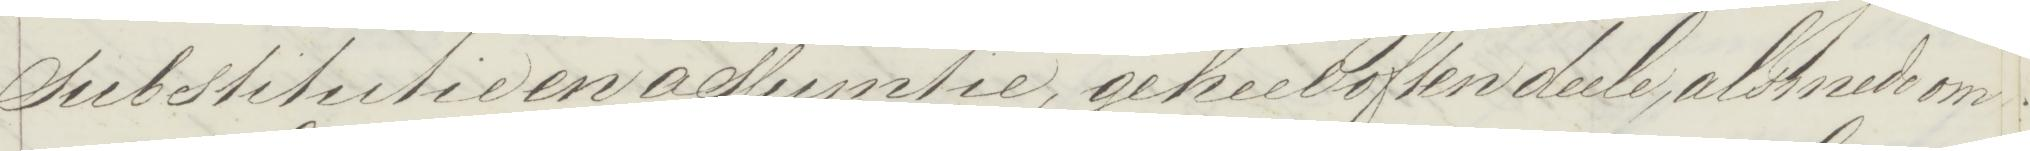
Substitutie en assumtie, geheel of ten deele, als mede om„
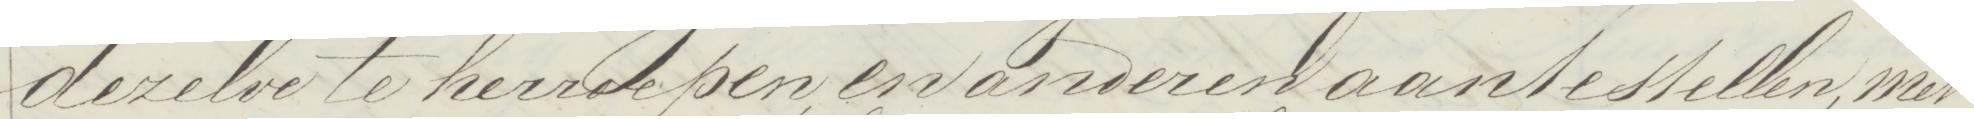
dezelve te herroepen, en anderen aan te stellen, met
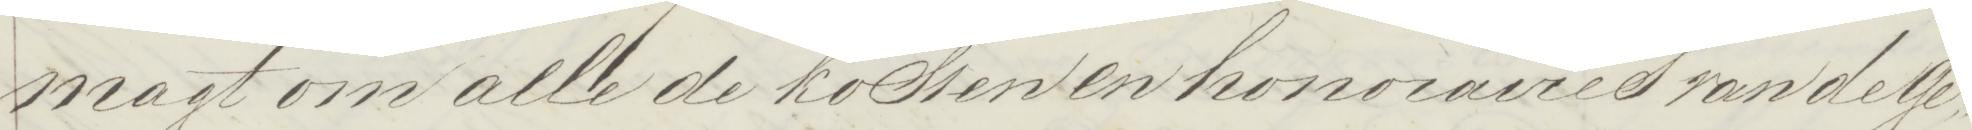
magt om alle de kosten en honoraires van de ge„
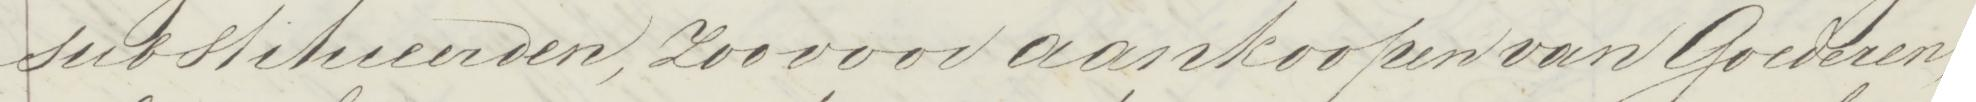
substitueerden, Zoo voor aankoopen van Goederen,
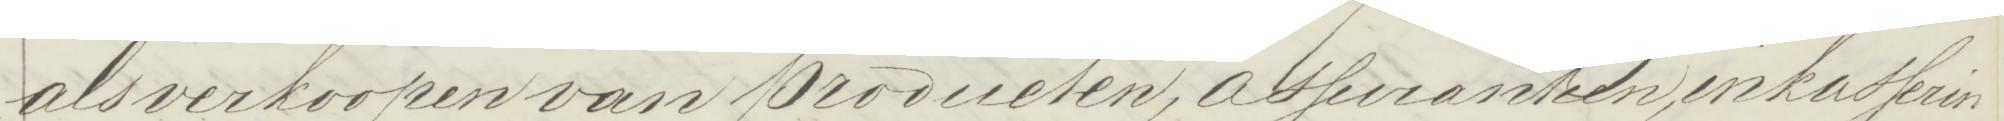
als verkoopen van Producten, Assurantien, inkasserin
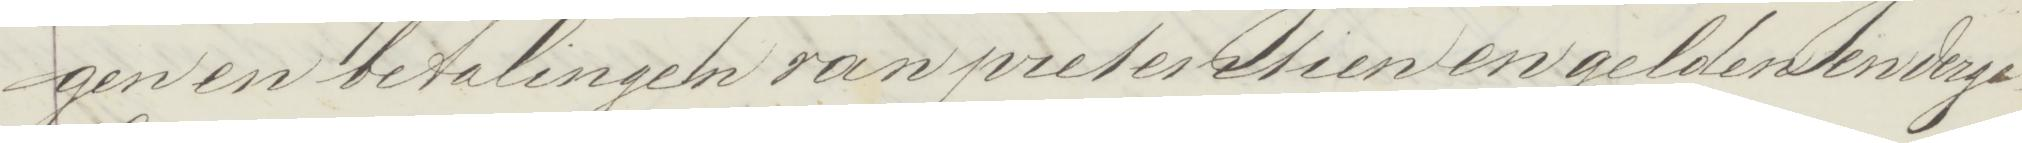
=gen en betalingen van presentien en gelden en derge
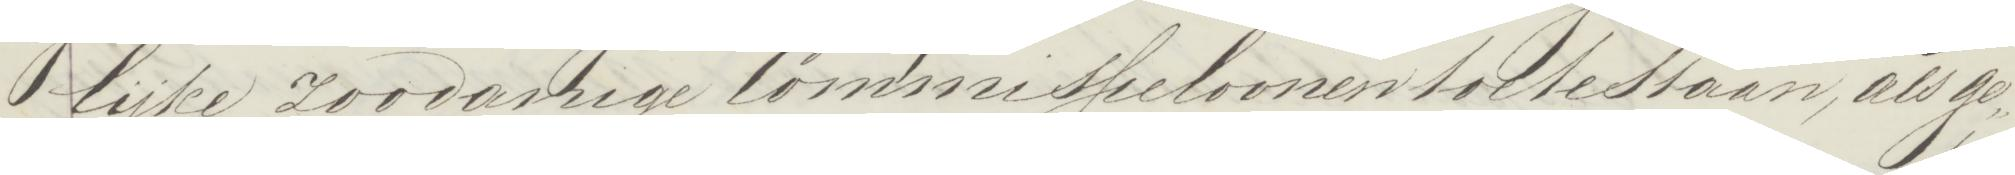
lijke zoodanige Commissieloonen toe te staan, als ge„
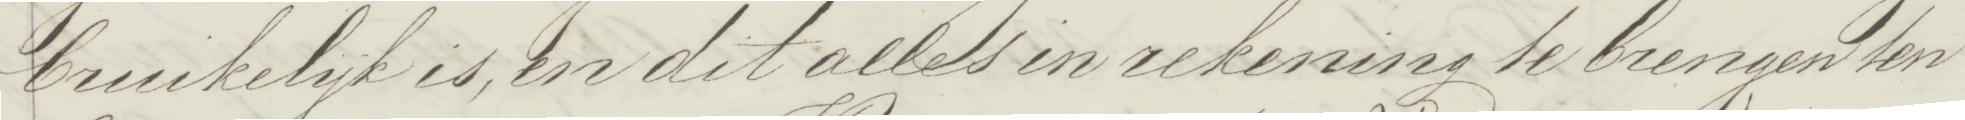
bruikelijk is, en dit alles in rekening te brengen ten
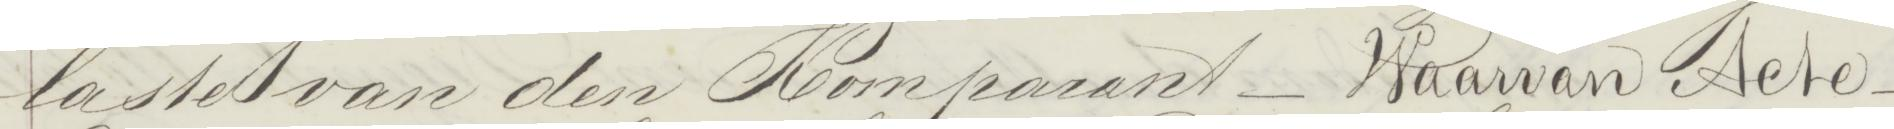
laste van den Komparant — Waarvan Acte-
